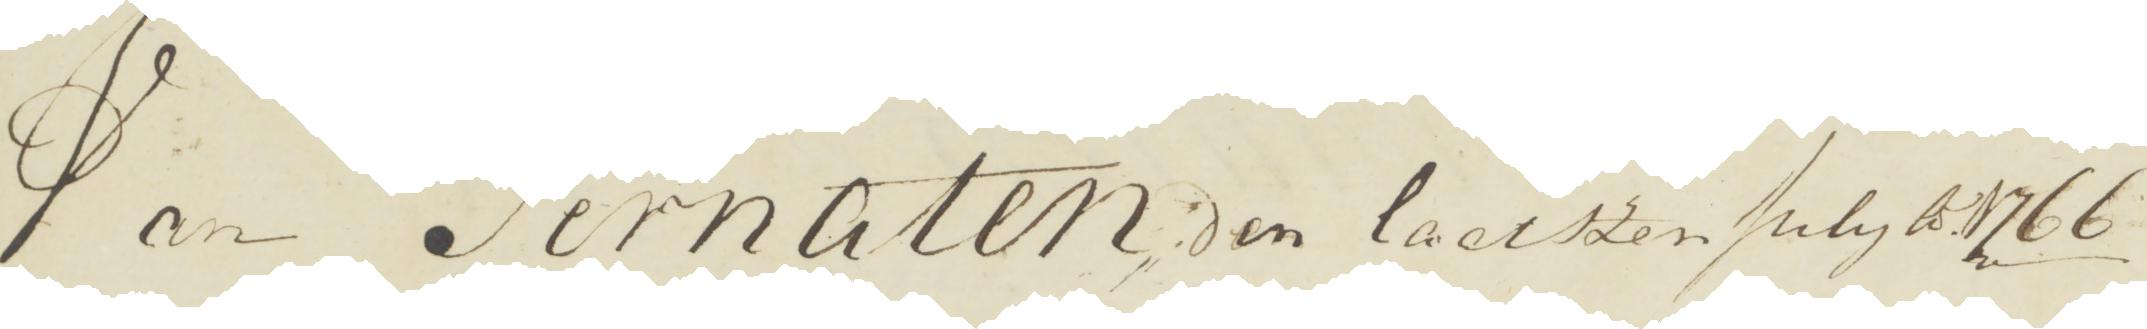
Van Ternaten, den laetsten July 15. 1766
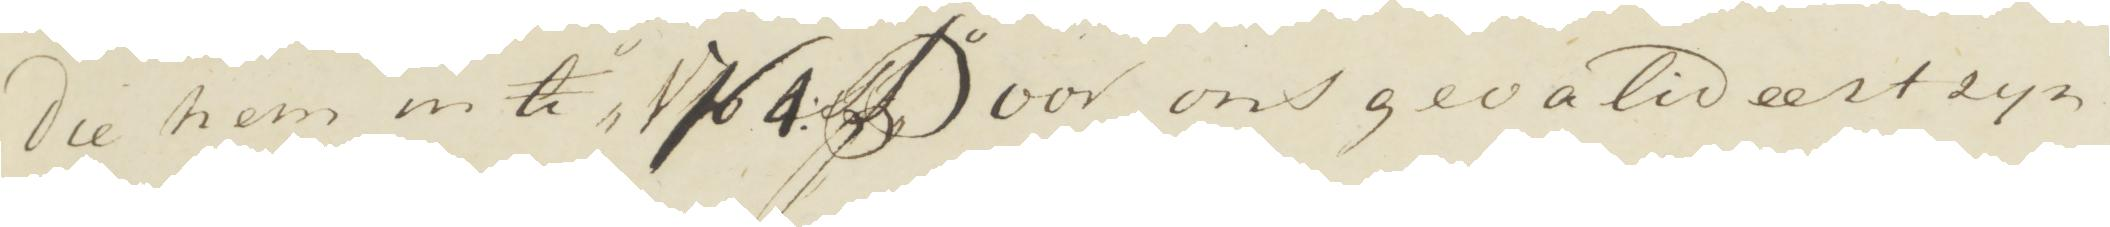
die hem in a„o 1764: Door ons gevalideert zyn
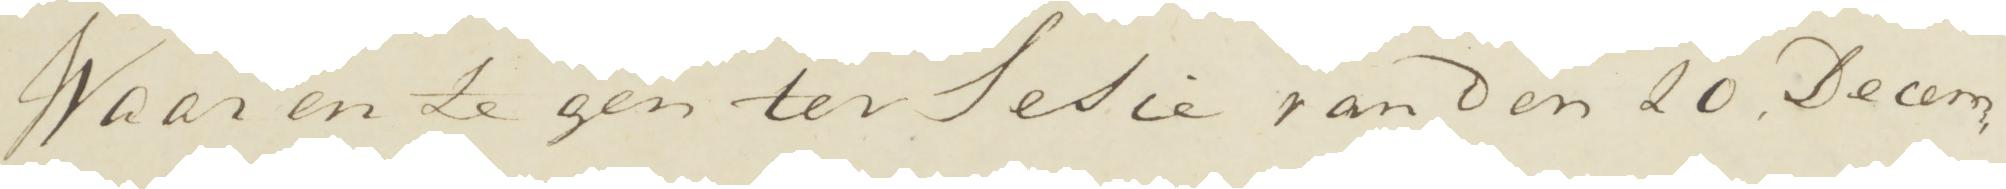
Waaren tegen ter sesie van den 20. Decem„
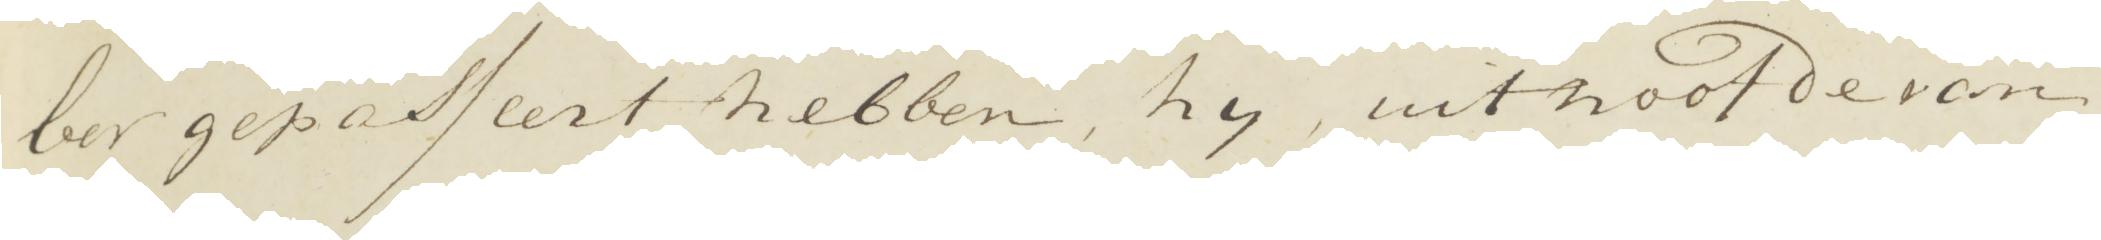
ber gepasseert hebben, hy, uit hoofde van
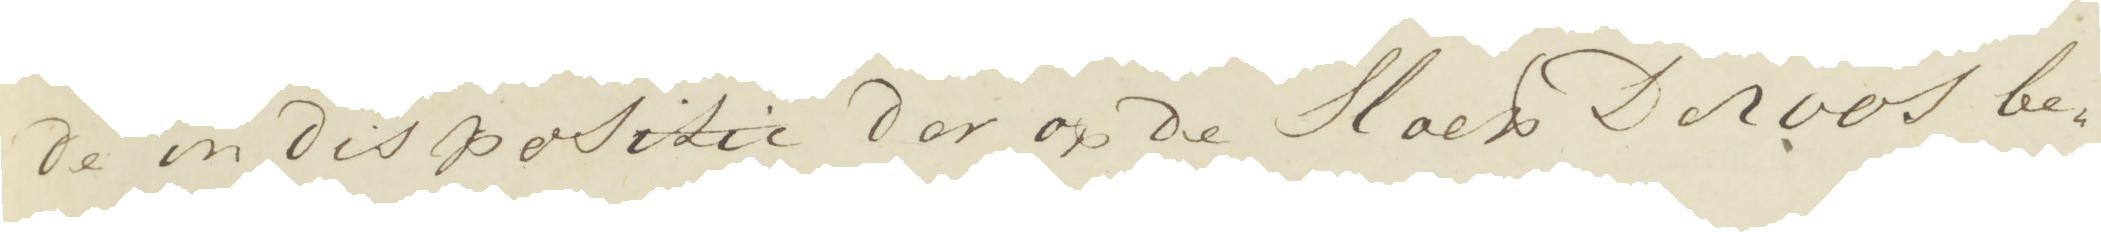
de in dispositie der op de sloep De roos be„
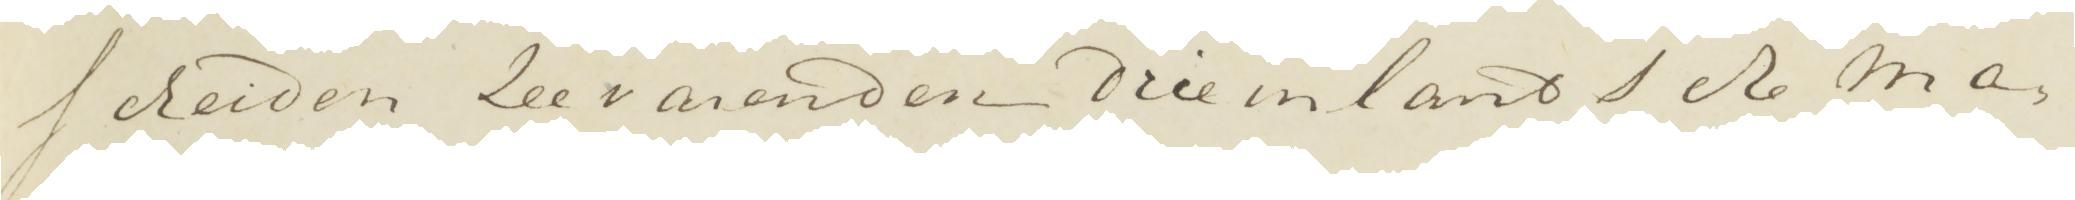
scheiden zeevarenden drie inlandsch ma
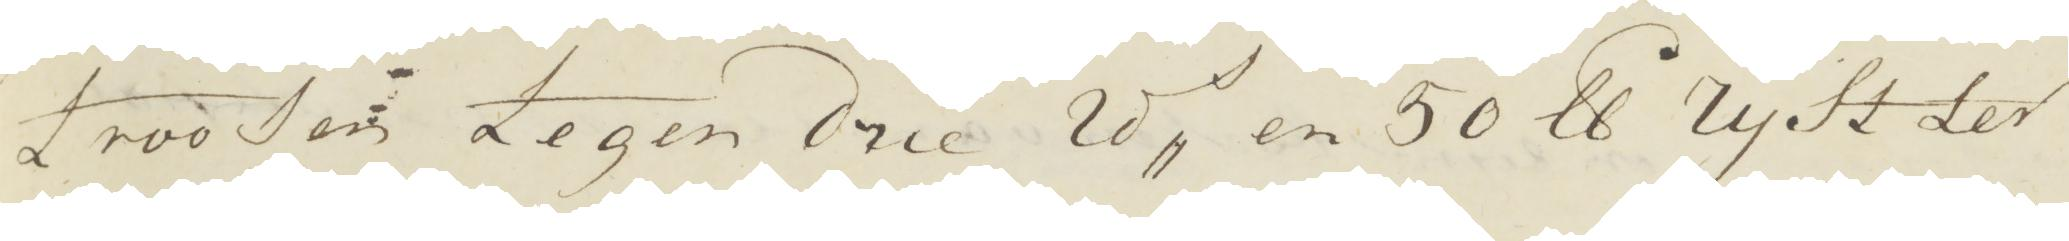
troosen tegen drie rd„s en 50 lb ryst ter
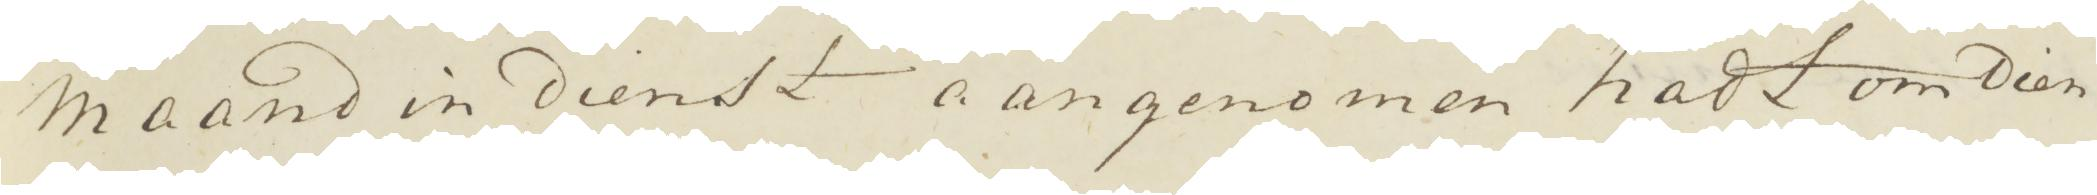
maand in dienst aangenomen hadt om dien
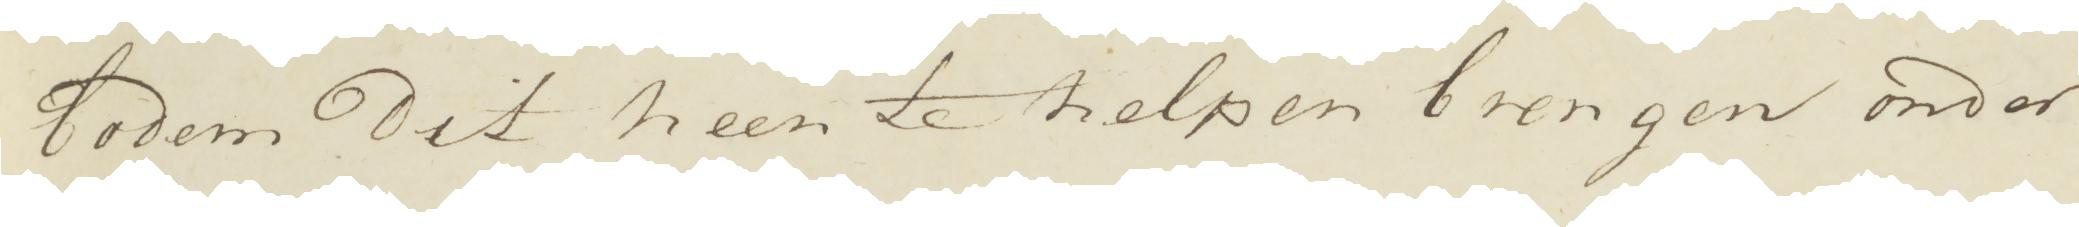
bodem dit heen te helpen brengen onder
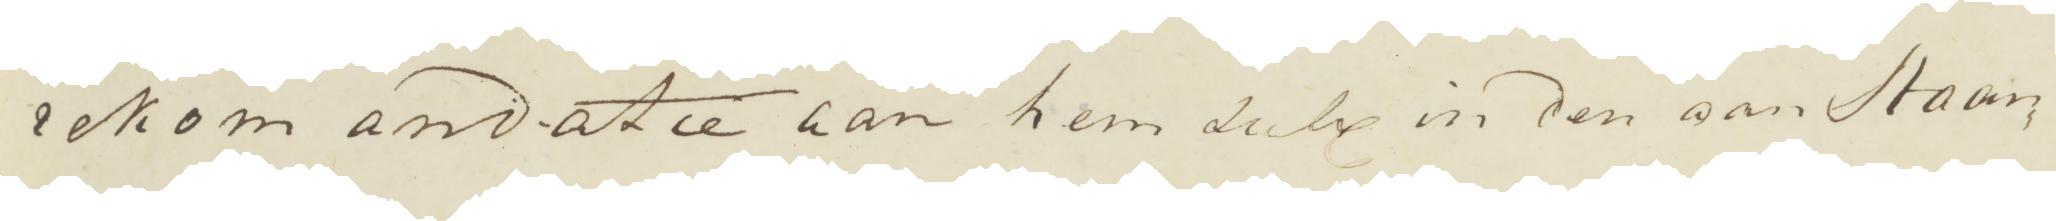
rekomandatie aan hem zulx in den aan staan„
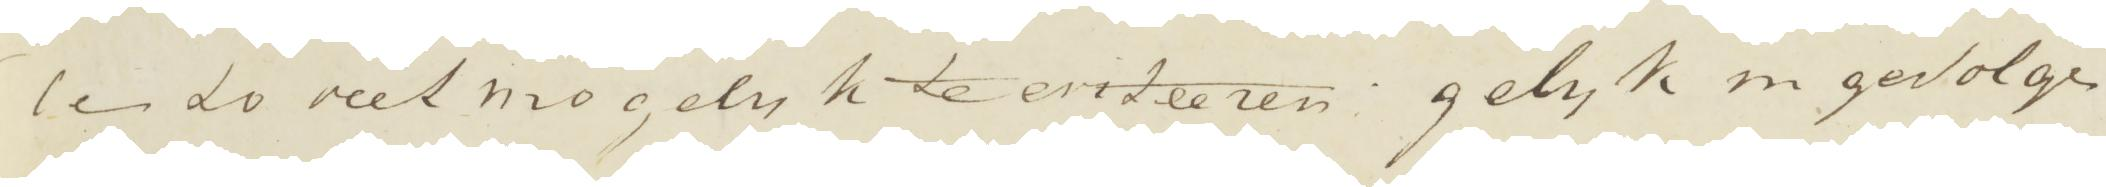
de zo veel mogelyk te eviteeren: gelyk ingevolge
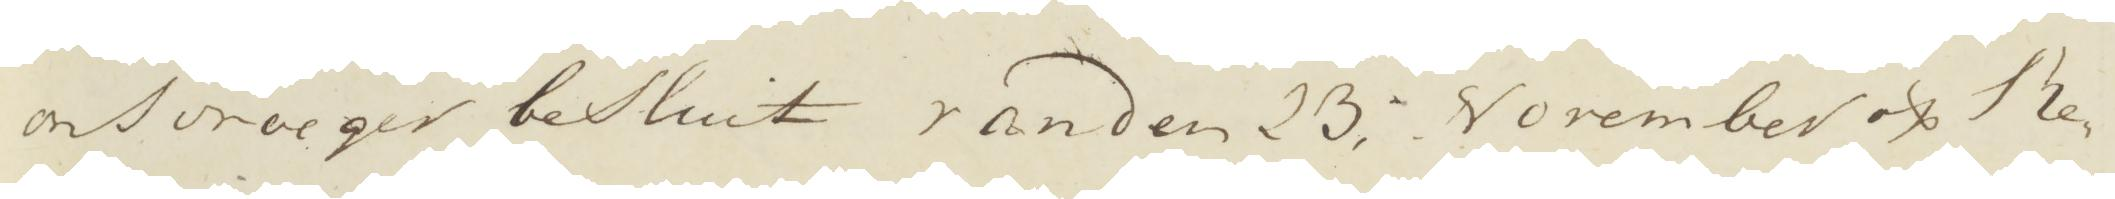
ons vroeger besluit van den 23,' November op Re„
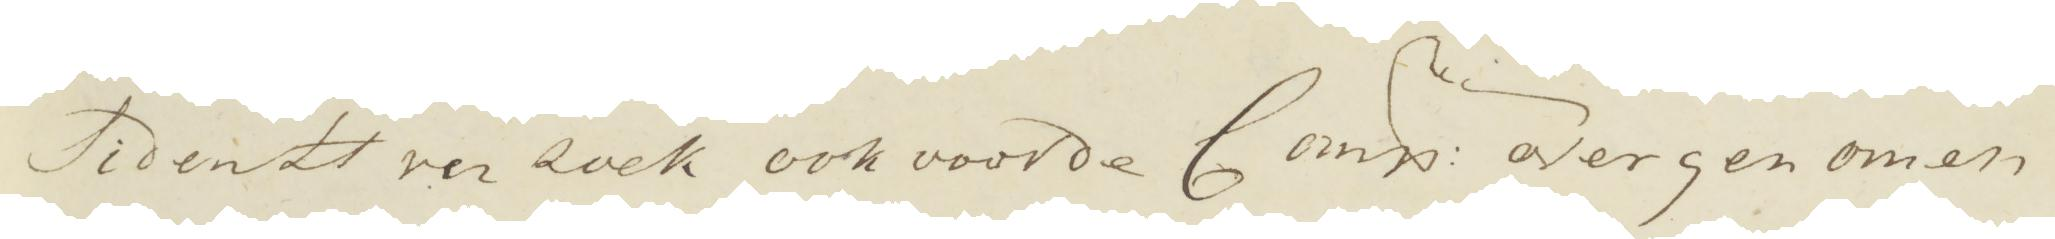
sidents verzoek ook voor de Comp: overgenomen
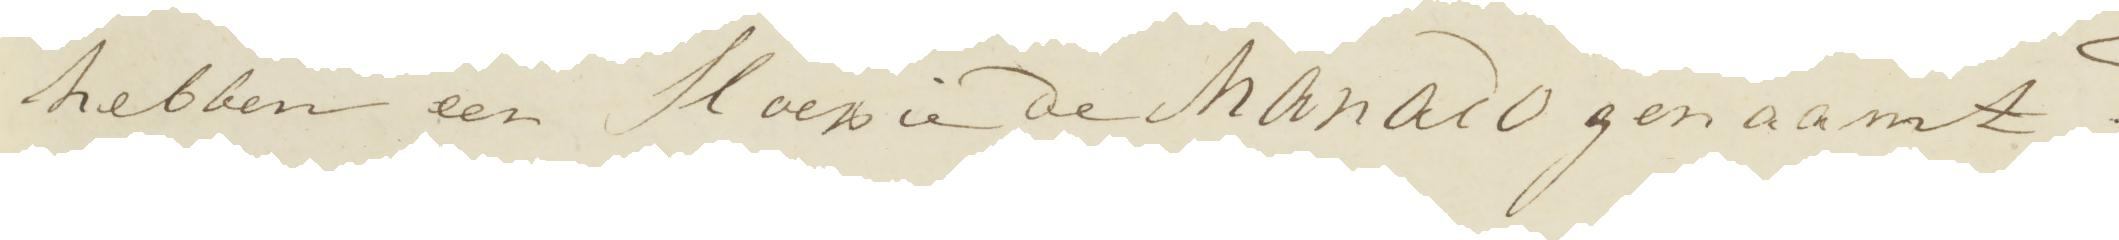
hebben een sloepie de Manaco genaamt
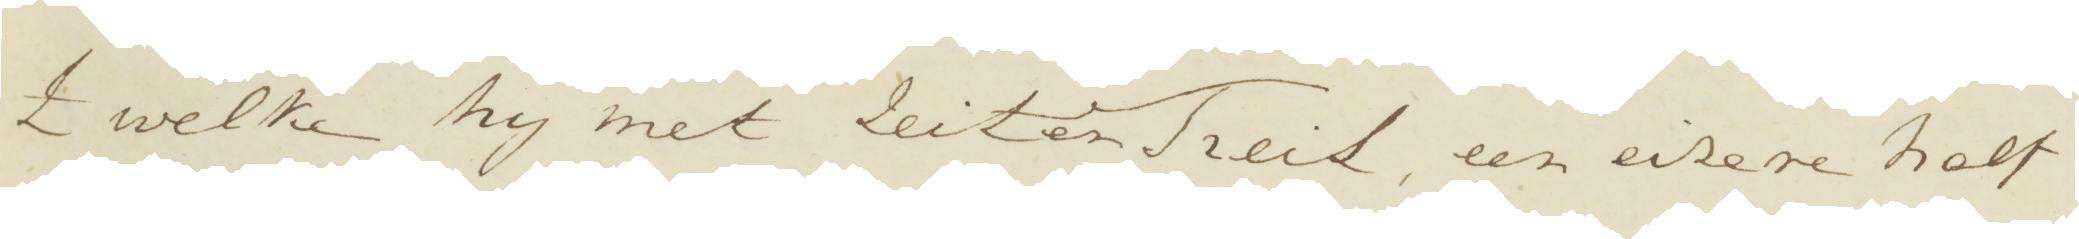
t welke hy met zeil en heil, een eizere half
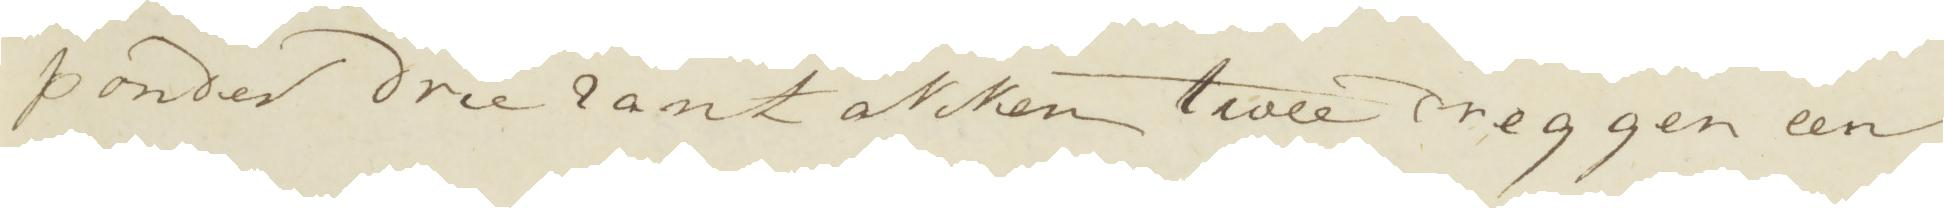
ponder drie rantakken twee dreggen een
